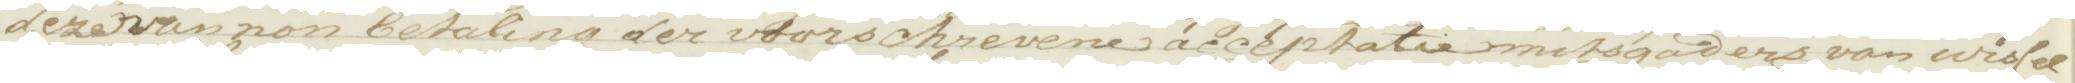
deze van non betaling der voorschrevene acceptatie mitsgaders van wissel
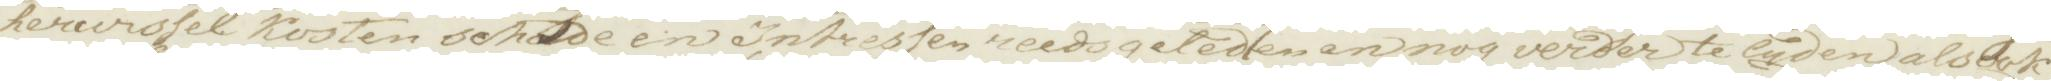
herwissel kosten schade en Intressen reeds geleden en nog verder te lyden als ook
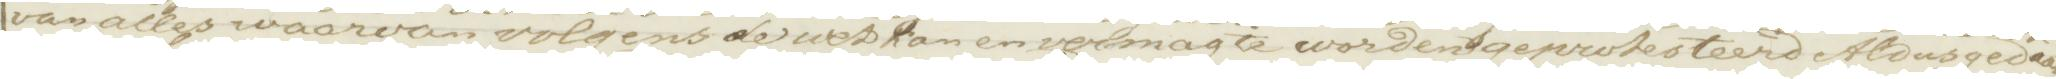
van alles waarvan volgens de wet kan en vermag te worden geprotesteerd Aldus gedaan
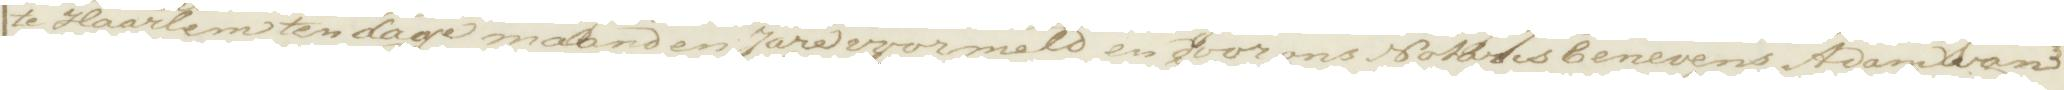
te Haarlem ten dage maanden Jare voormeld en door ons Notaris benevens Adam van
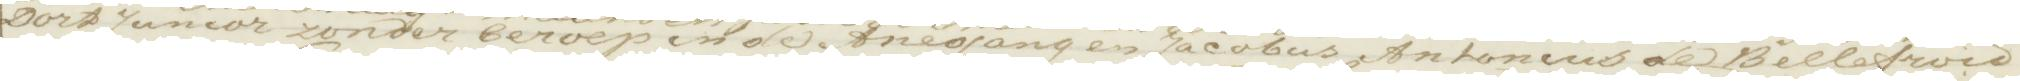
Dort Junior zonder beroep in de Anegang en Jacobus Antonius de Bellefroid
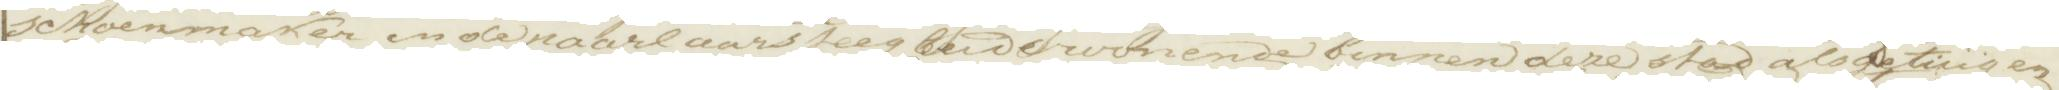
schoenmaker in de paarlaarsteeg beide wonende binnen deze stad als getuigen
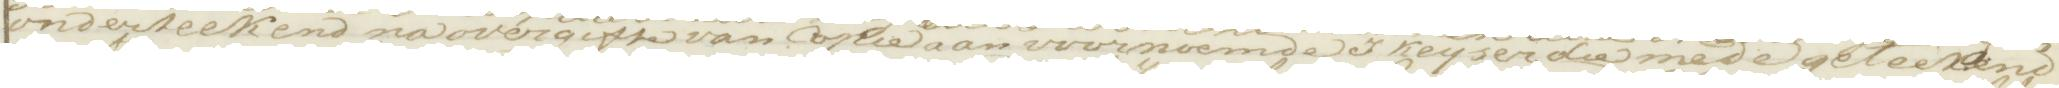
onderteekend na overgifte van copie aan voornoemde I Keyser die mede geteekend
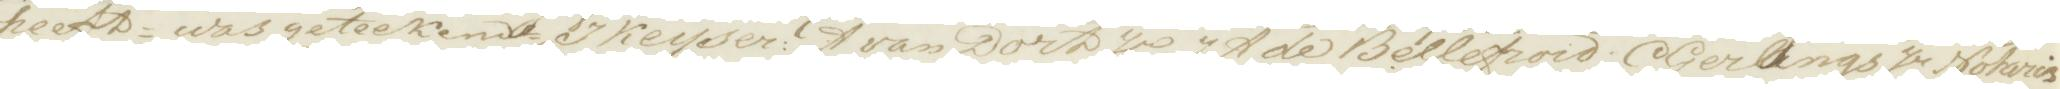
heeft = was geteekend I Keyser: A van Dort J„r A. de Bellefroid C Gerlings J„r Notaris
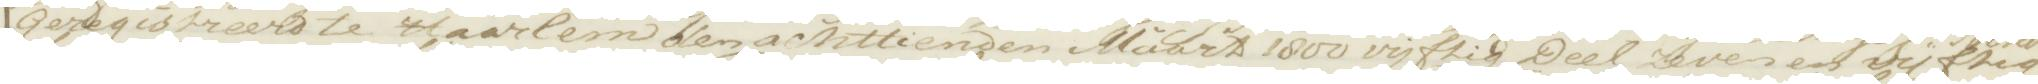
Geregistreerd te Haarlem den achttienden Maart 1800 vijftig Deel zeven en vijftig
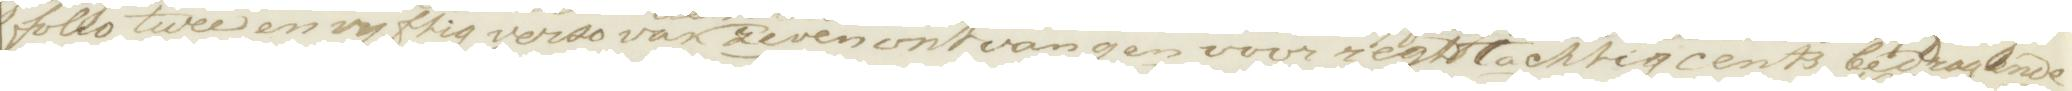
folio twee en vyftig verso vak zeven ontvangen voor regt tachtig cents bedragende
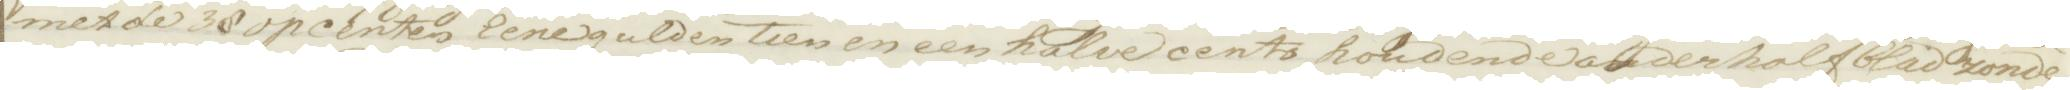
met de 38 opcenten Eene gulden tien en een halve cents houdende anderhalf blad zonder
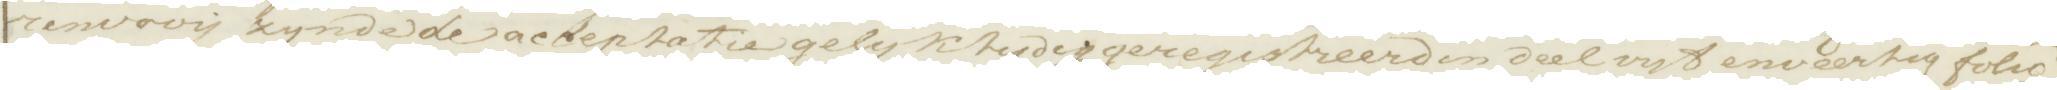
renvooij zynde de acceptatie gelyktydig geregistreerd in deel vyf enveertig folio
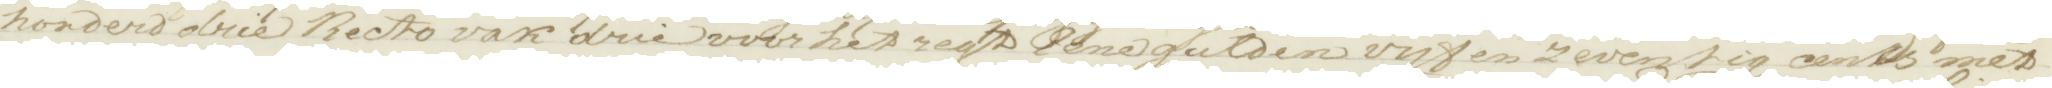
honderd drie Recto vak drie voor het regt Eene gulden vyf en zeventig cents met
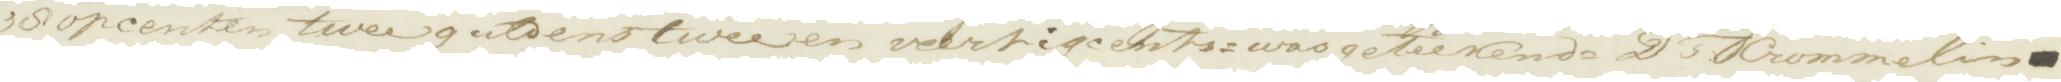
38 opcenten twee guldens twee en veertig cents = was geteekend = D F Crommelin
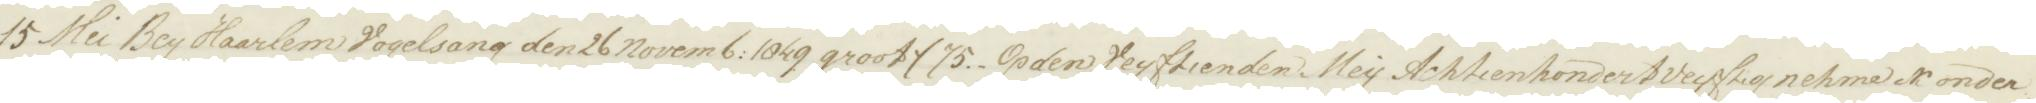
15 Mei Bey Haarlem Vogelsang den 26 Novemb: 1849 groot ƒ 75. — Op den Veyftienden Meij Achtienhondert veyftig nehme ik onder
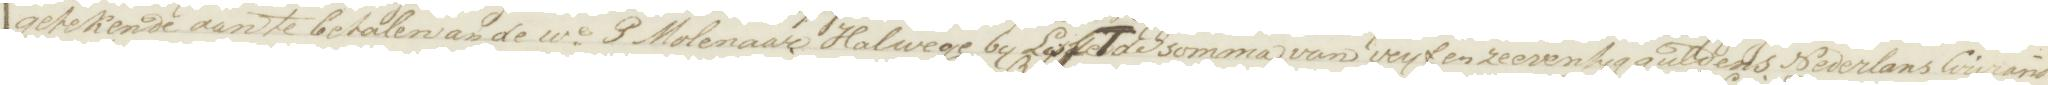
getekende aan te betalen an de w:e P Molenaar Halwege by Lijste T de somma van veyf en zeeventig guldens, Nederlans Courans
